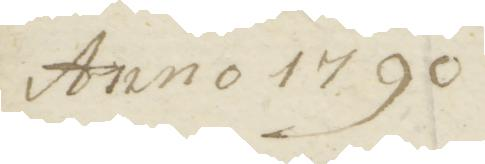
Anno 1790
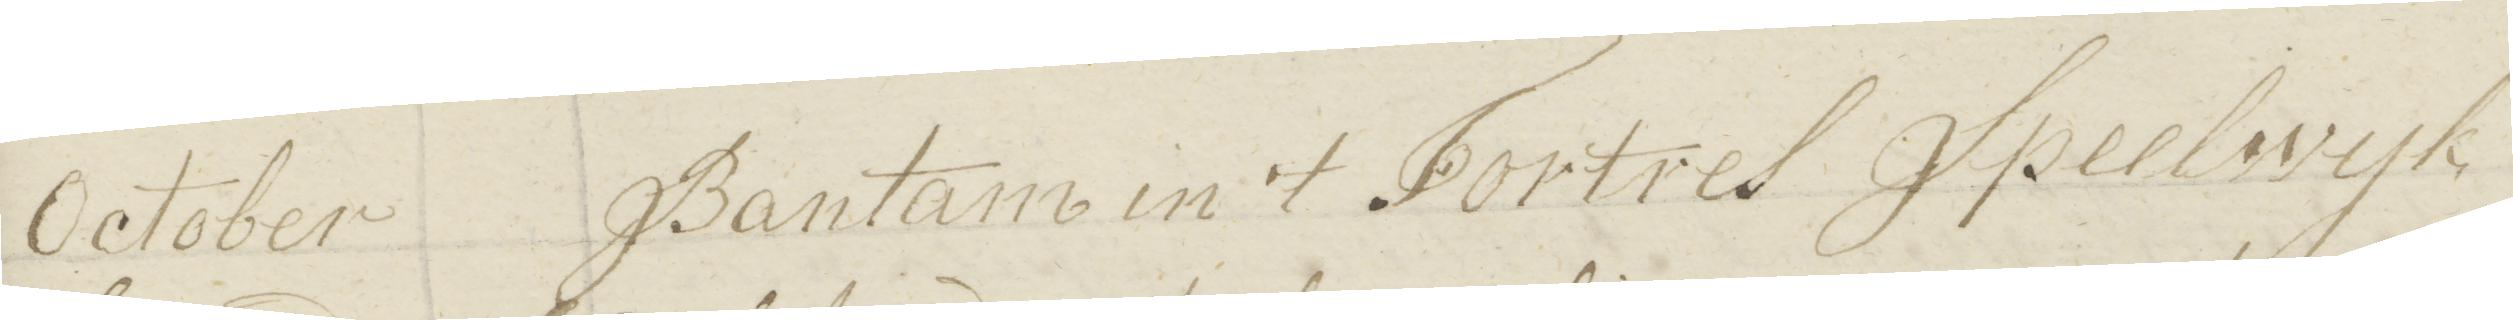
October Bantam in ’t Fortres Speelwyk
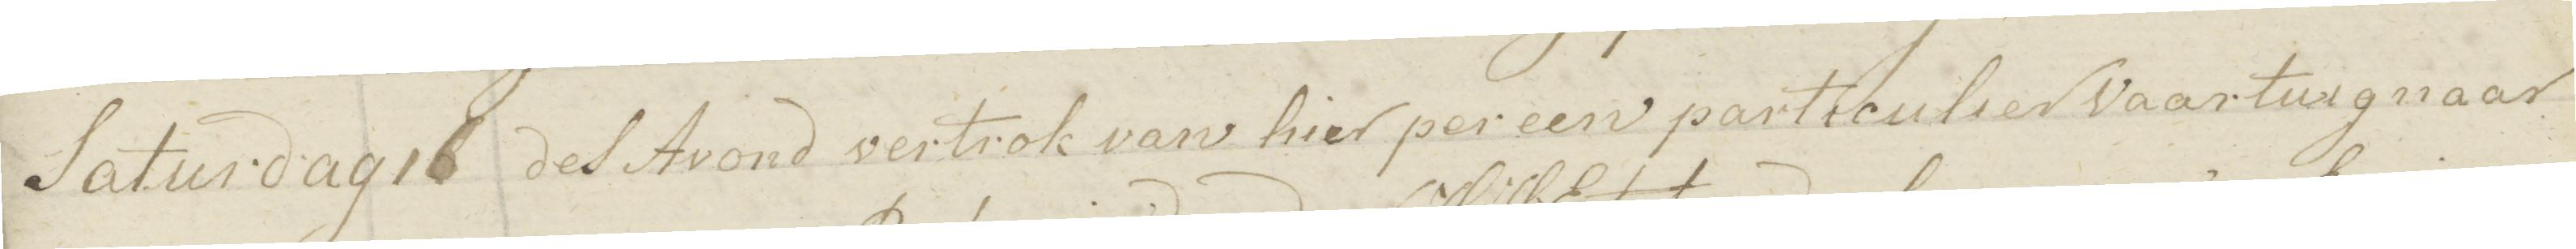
Saturdag 16 des Avond vertrok van hier per een particulier vaartuig naar
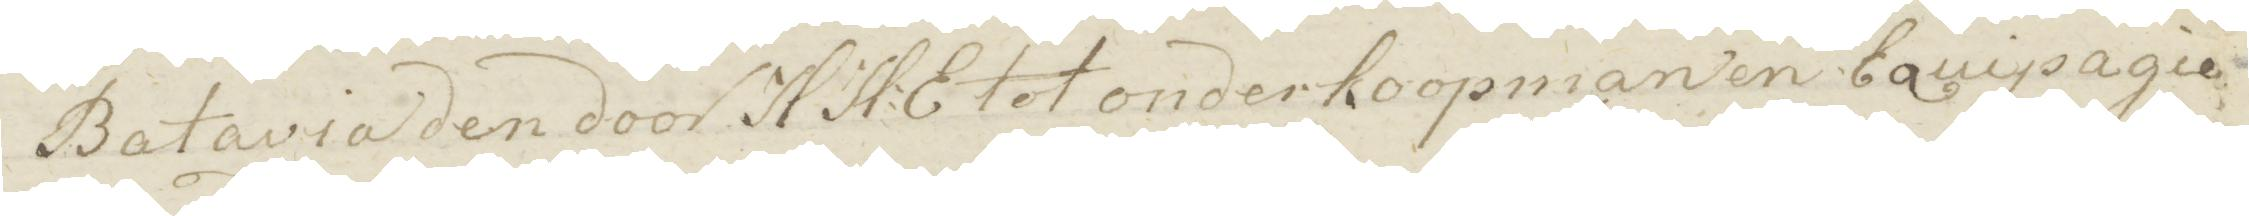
Batavia den door H: H: E tot onderkoopman en Equipagie
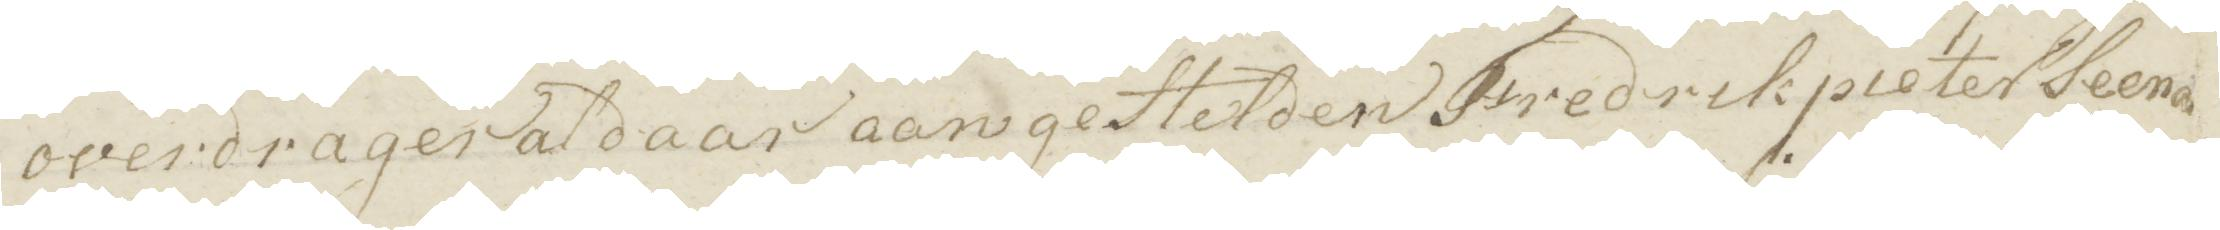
overdrager aldaar aangestelden Fredrik pieter seena
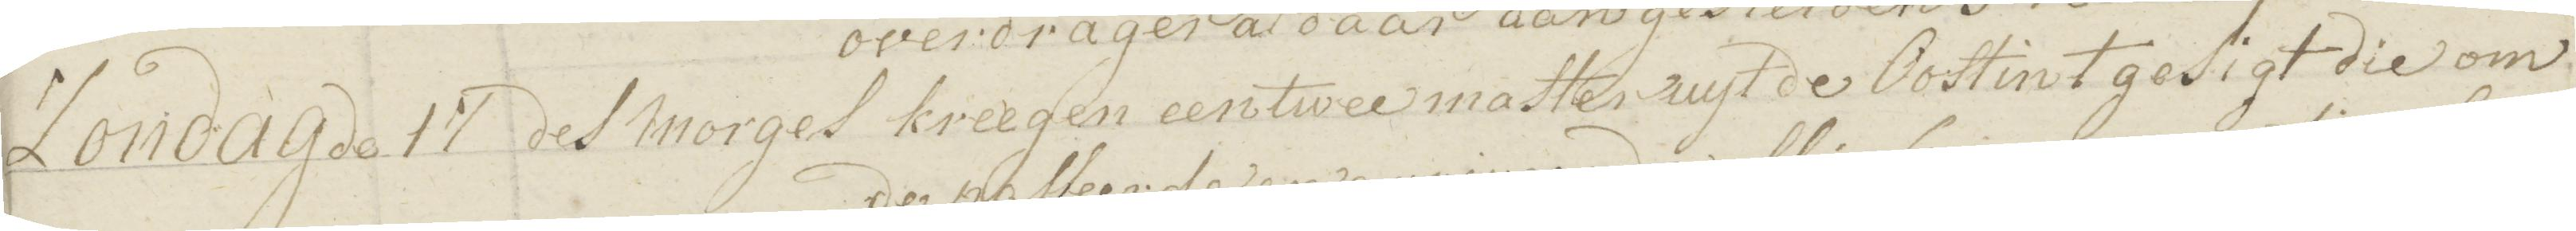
Zondag de 17 des morges kreegen een twee master uyt de Oost int gesigt die om
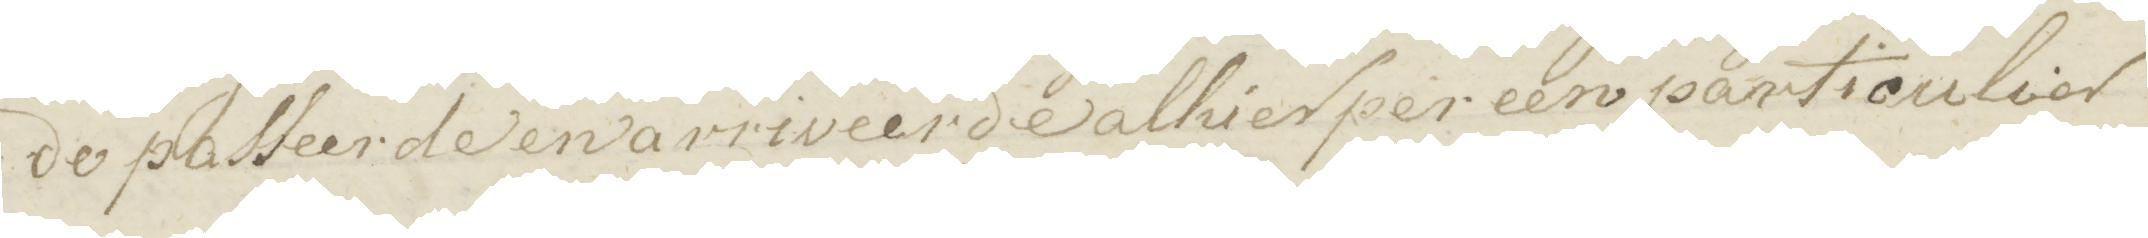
de passeerde en arriveerde alhier per een particulier
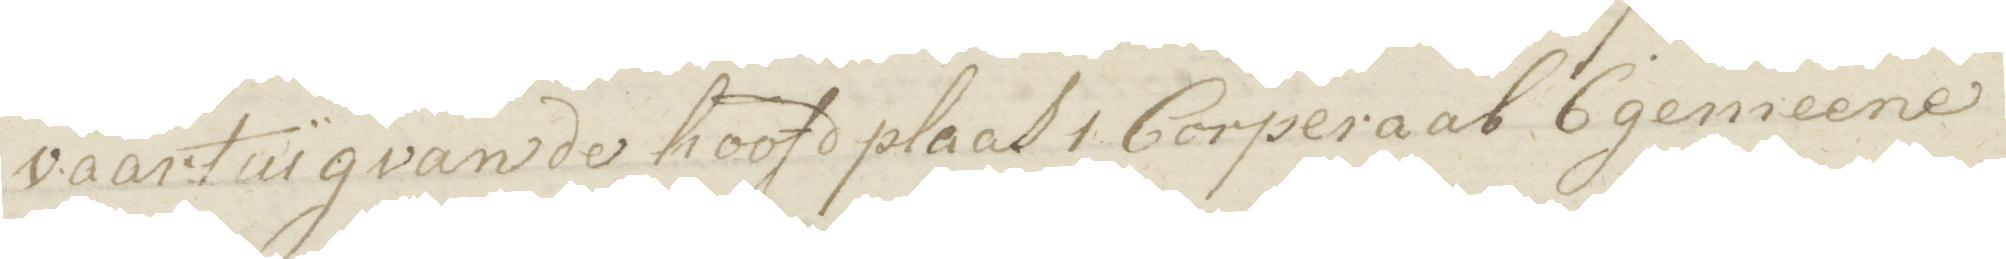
vaartuig van de hoofdplaas 1: Corperaal 6 gemeene
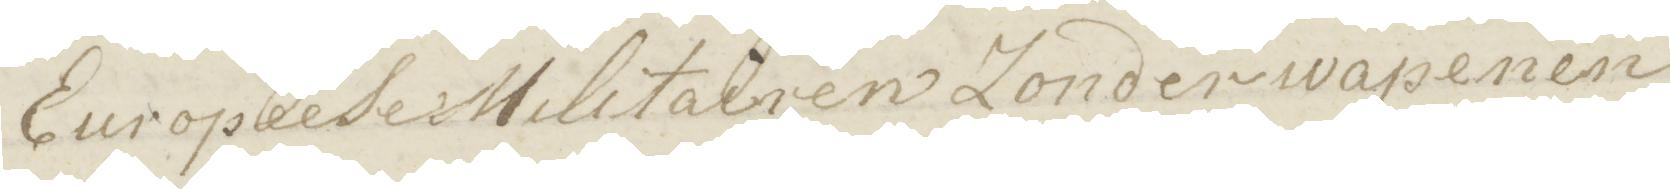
Europeese Militairen zonder wapenen
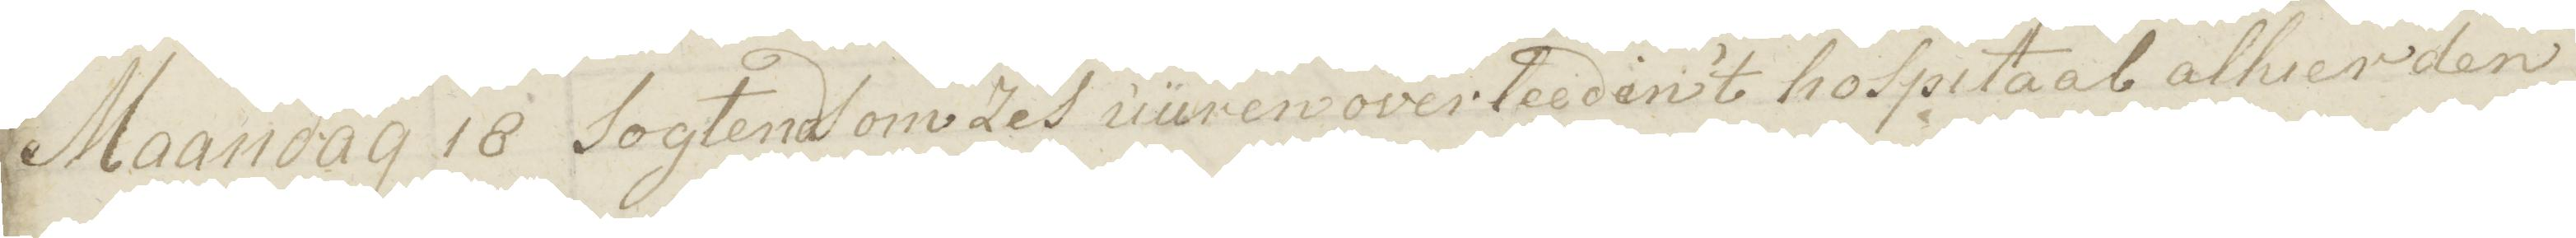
Maandag 18 sogtends om zes uuren overleed in’t hospitaal alhier den
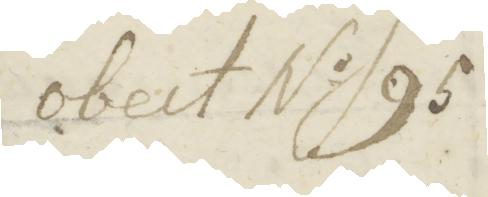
obeit N-o 95
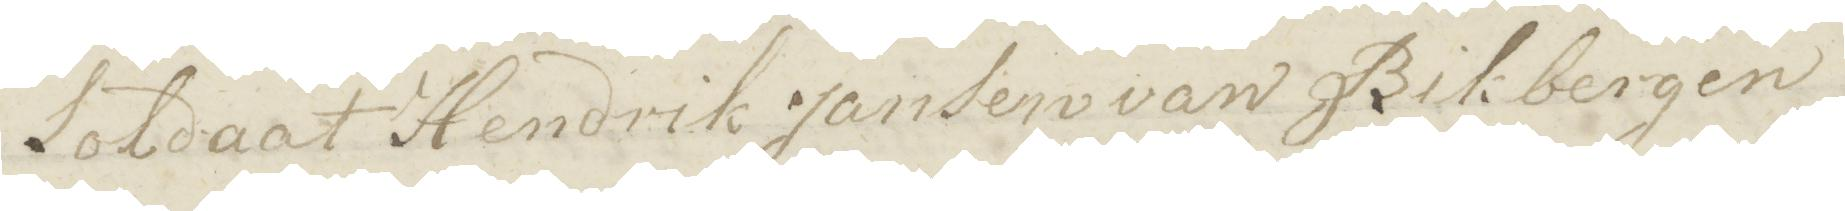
soldaat Hendrik Jansen van Bikbergen
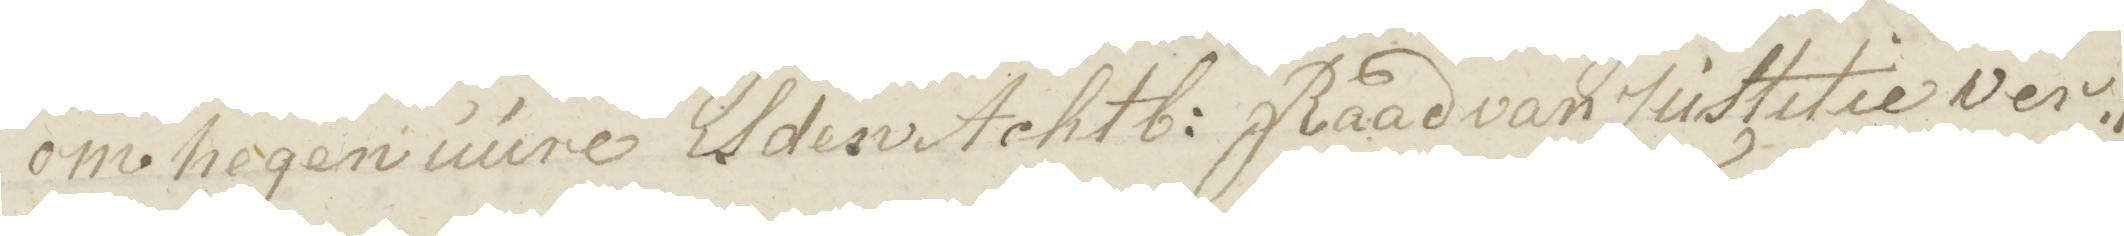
om negen uure is den Achtb: Raad van Justitie ver„
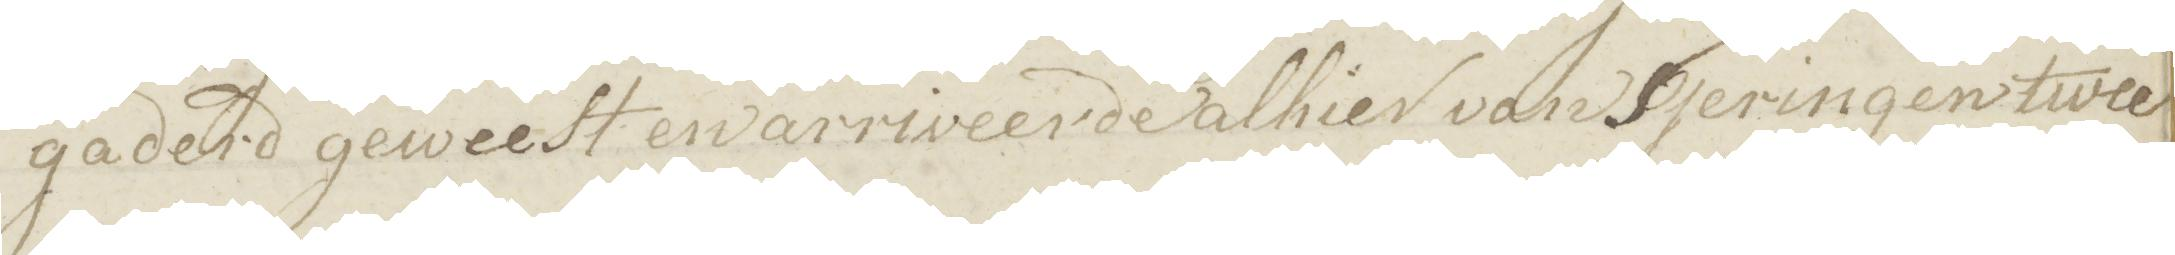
gaderd geweest en arriveerde alhier van Tjeringen twee
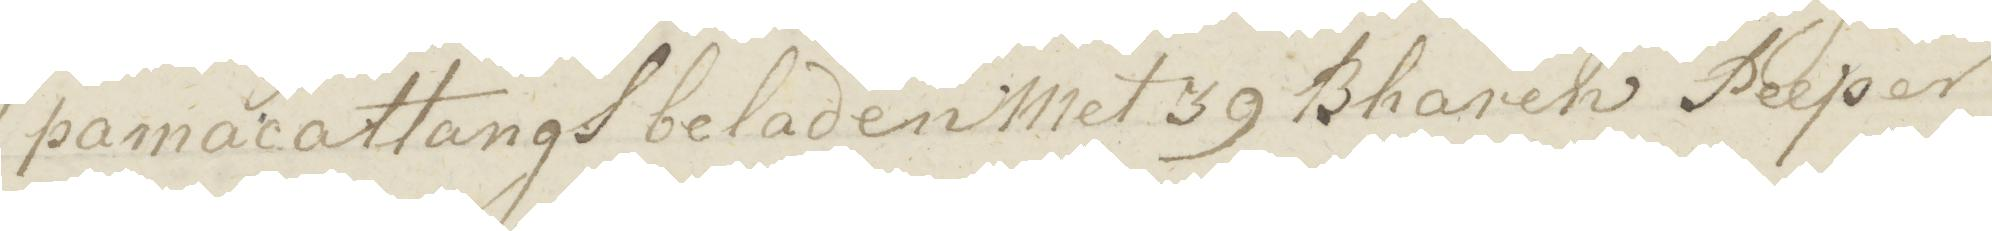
pamacattangs beladen met 39 Bharen Peeper
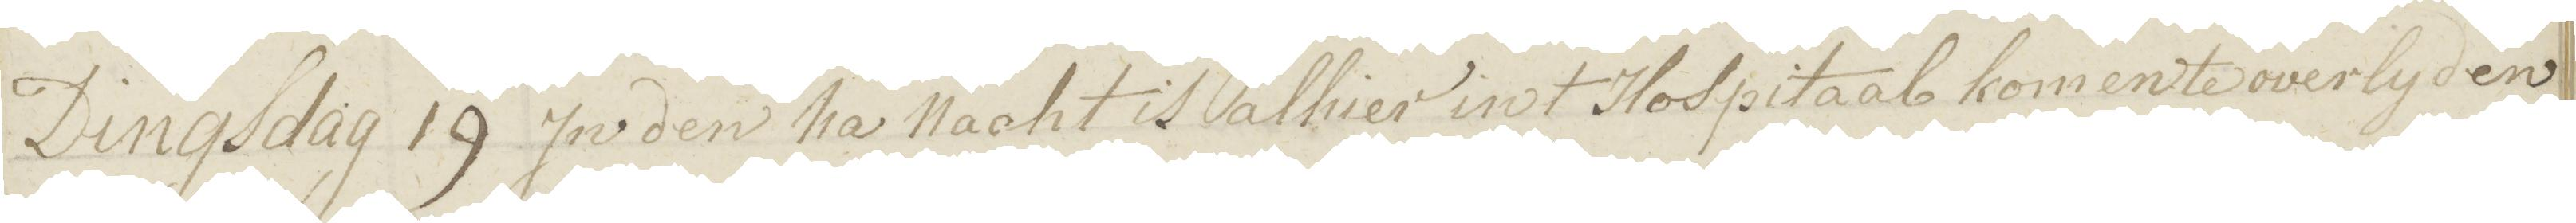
Dingsdag 19 Jn den na nacht is alhier int Hospitaal komen te overlyden
